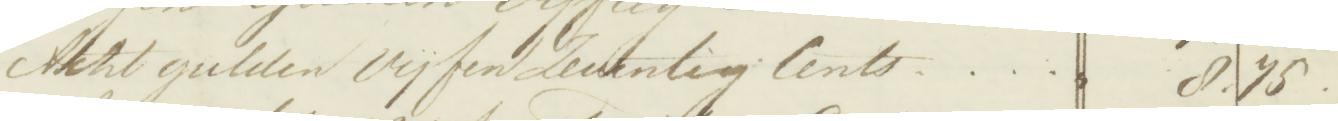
Acht gulden vijfen Zeventig Cents . . . . „ 8.75
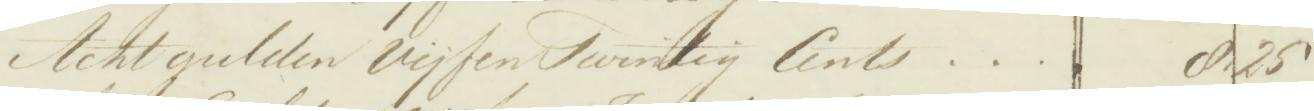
Acht gulden vijfen Twintig Cents . . . „ 8.25
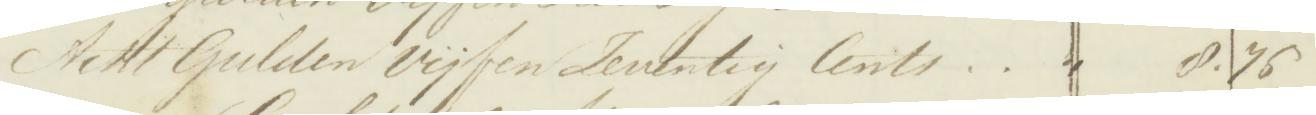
Acht Gulden vijfen Zeventig Cents . . „ 8.75
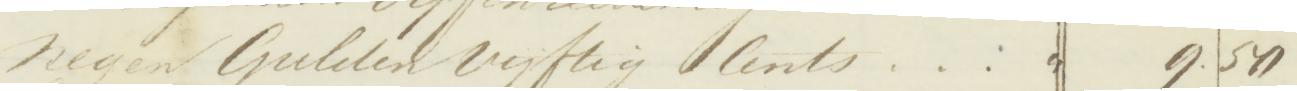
negen Gulden vijftig Cents . . . „ 9.50
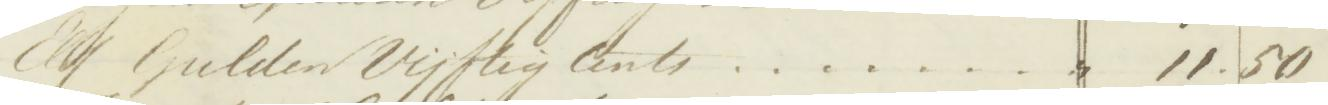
Elf Gulden Vijftig Cents . . . . . . . „ 11.50
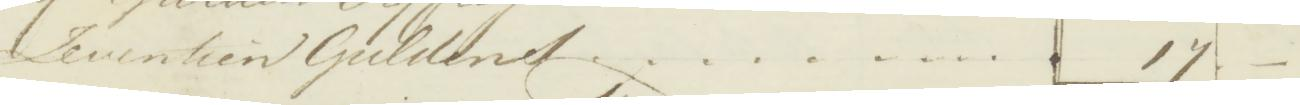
Zeventien Guldens . . . . . . . . . „ 17.—
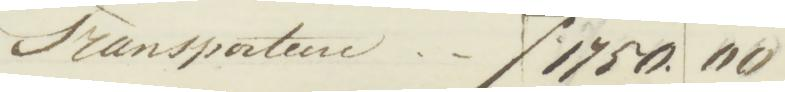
Transporteere . . f 1750. 00
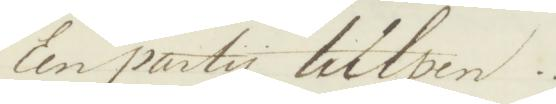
Een partij tulpen.
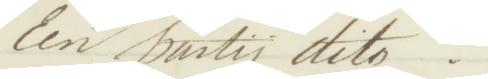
Een partij dito .
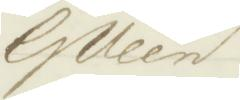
GVeen
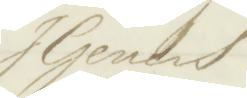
J Gevers
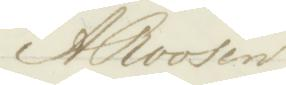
ARoosen
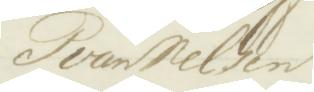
P van Velsen
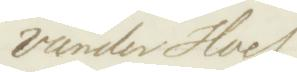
vander Hoef
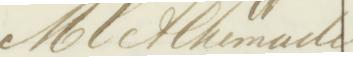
Ml Alkemade
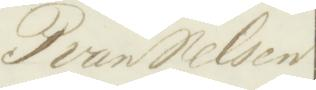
P vanVelsen
